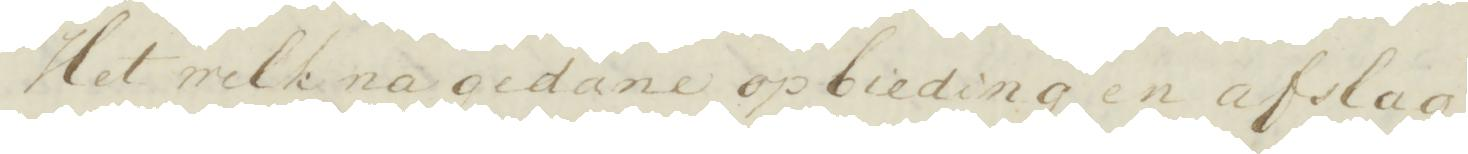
Het welk na gedane opbieding en afslag
